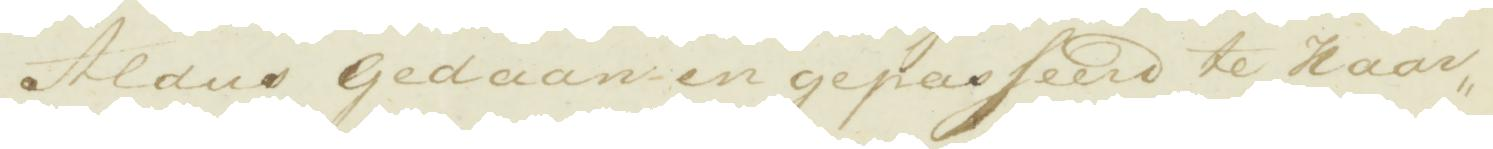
Aldus gedaan en gepasseerd te Haar„
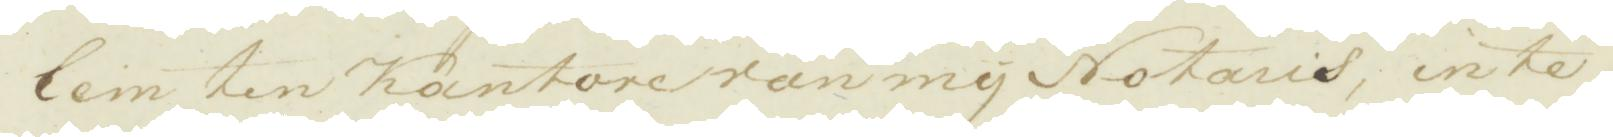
lem ten Kantore van mij Notaris, in te
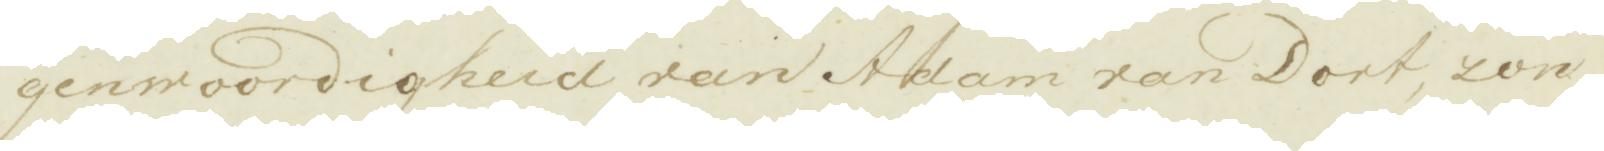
genwoordigheid van Adam van Dort, zon
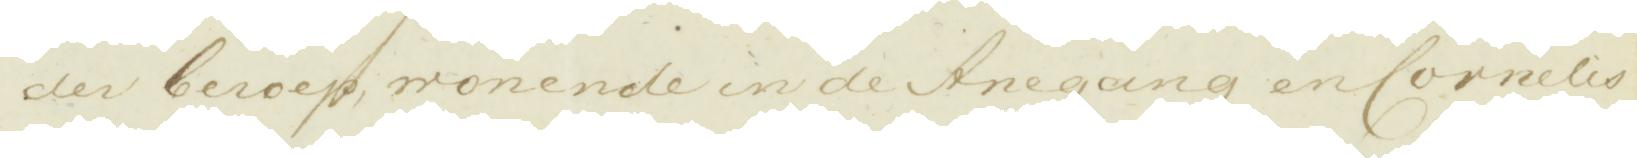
der beroep, wonende in de Anegang en Cornelis
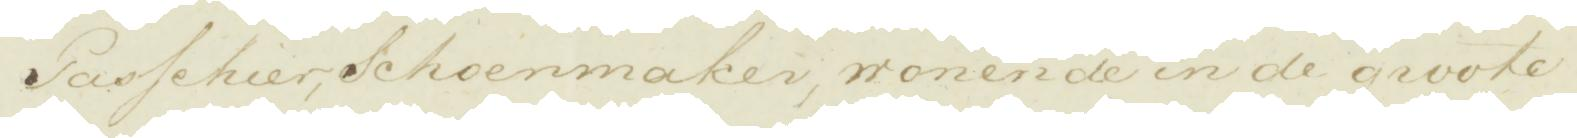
Passchier, Schoenmaker, wonende in de groote
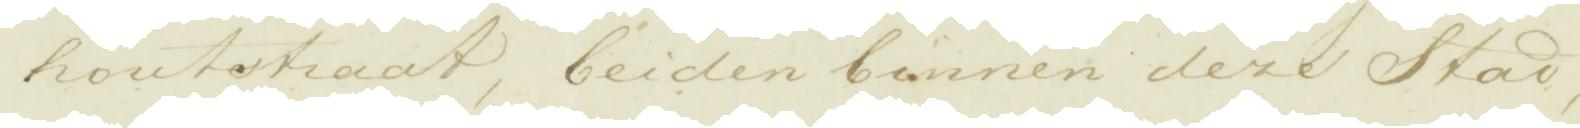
houtstraat, beiden binnen deze Stad,
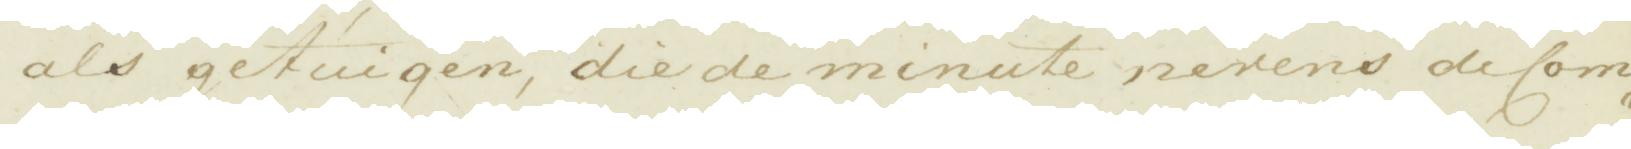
als getuigen, die de minute nevens de Com
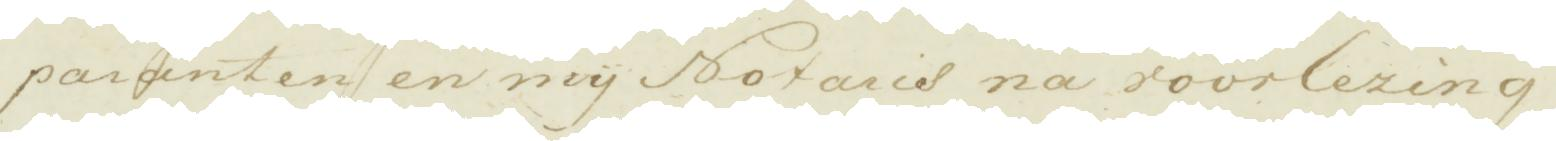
paranten en mij Notaris na voorlezing
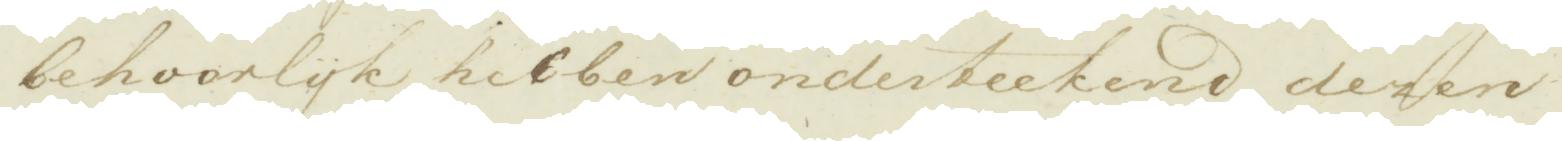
behoorlijk hebben onderteekend, dezen
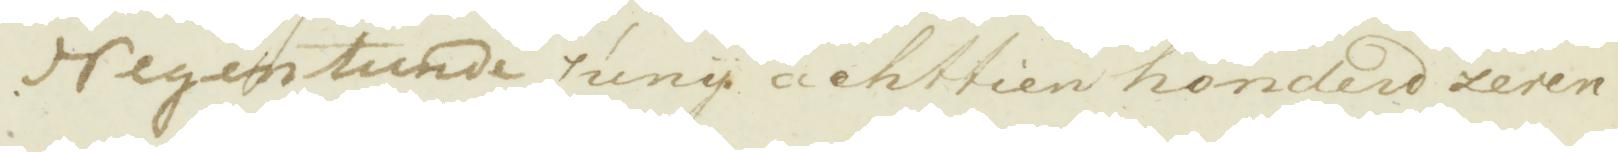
Negentiende Junij achttien honderd zeven
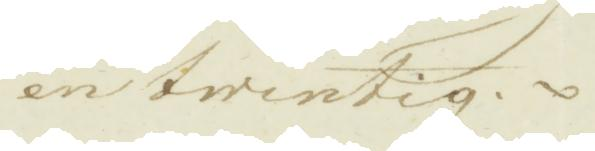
en twintig. —
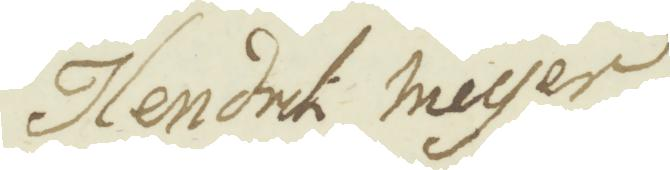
Hendrik Meyer
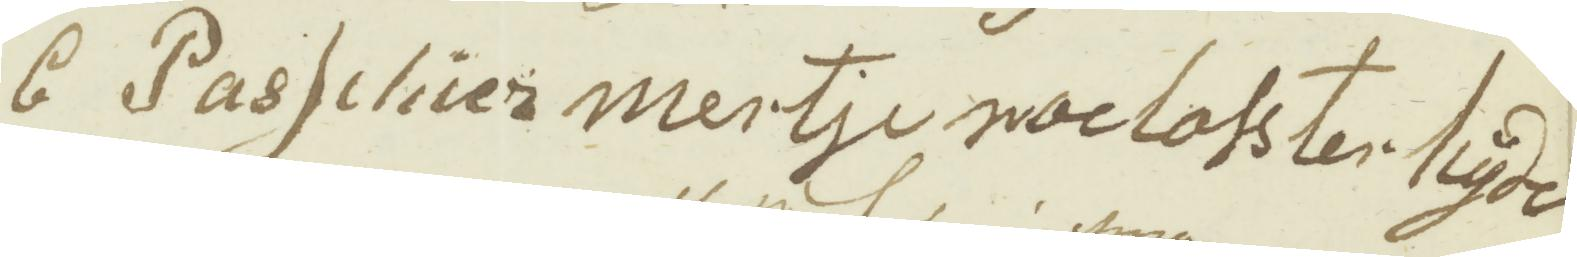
C Passchier mertje roelofs ter hijde
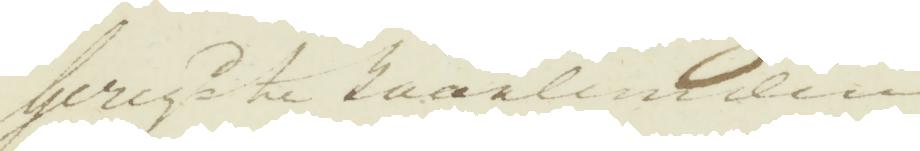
Gereg=d te haarlem den
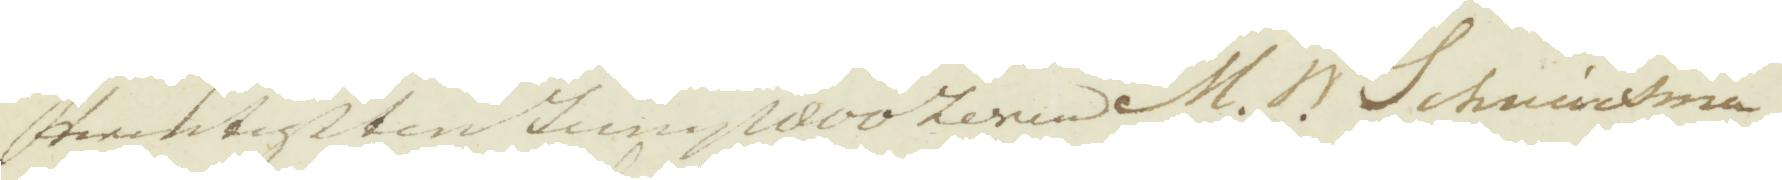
twintigsten Iunij 1800 zeven M. W. Schuursma
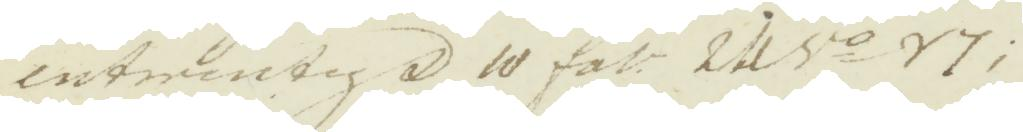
entwintig D 18 fol. 24 V=o V7;
